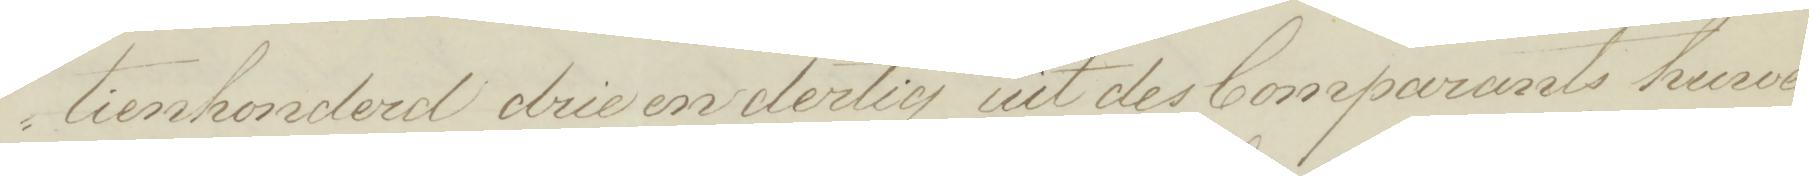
„tienhonderd drie en dertig uit des Comparants huwe
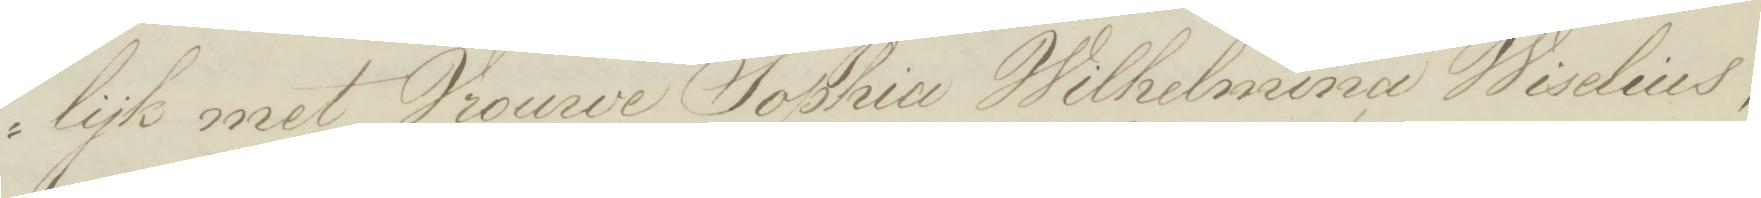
„lijk met Vrouwe Sophia Wilhelmina Wiselius,
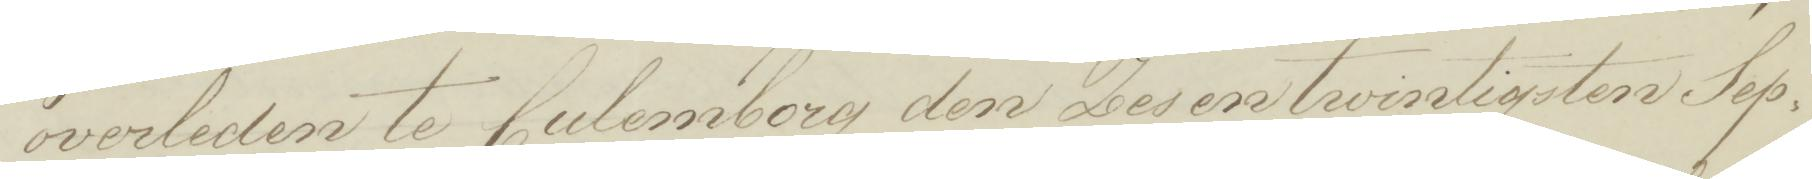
overleden te Culemborg den Zes en twintigsten Sep„
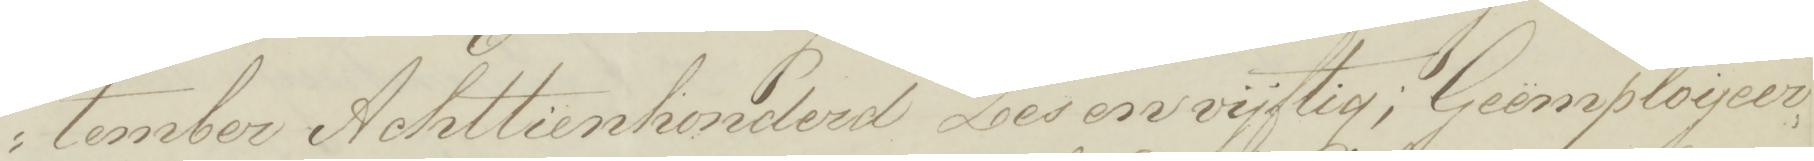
„tember Achttienhonderd Zes en vijftig, Geemploijeer„
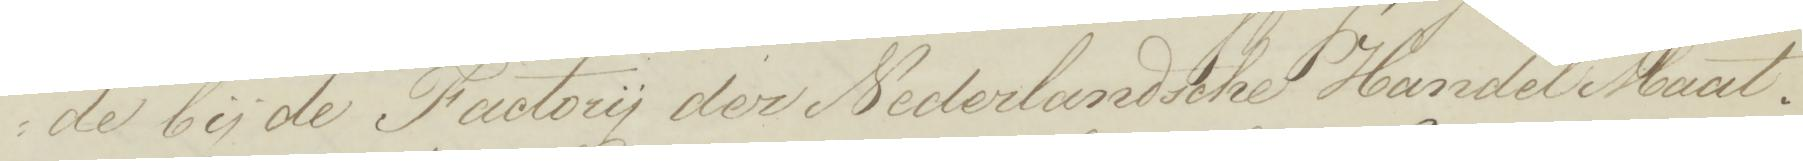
„de bij de Factorij der Nederlandsche Handel Maat„
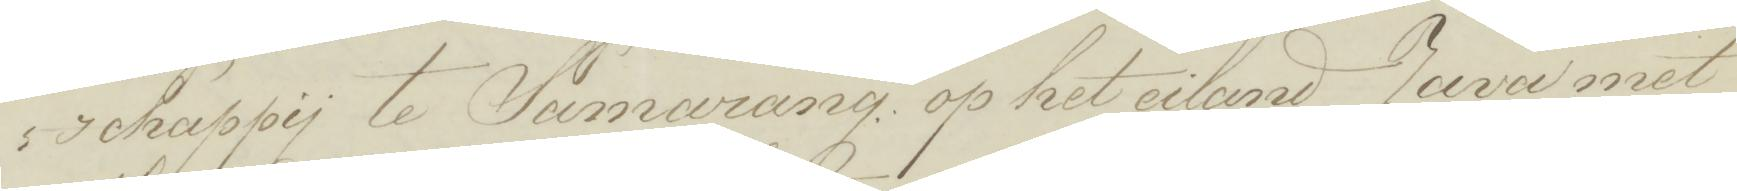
„schappij te Samarang, op het eiland Java met
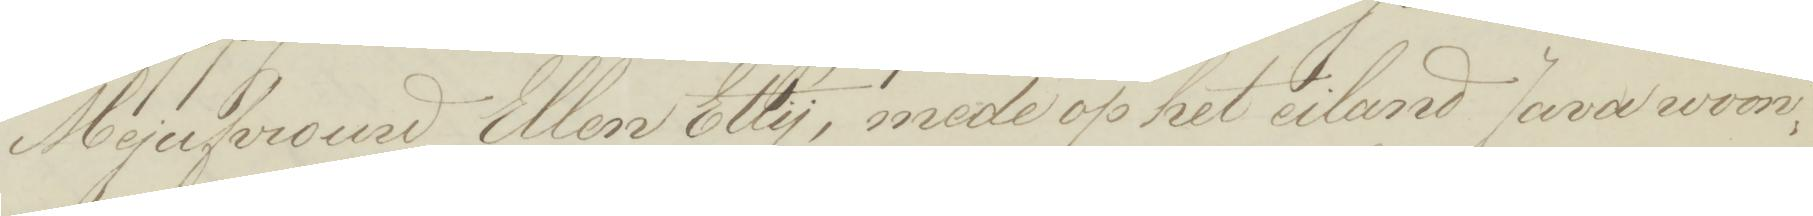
Mejufvrouw Ellen Ettij, mede op het eiland Java woon„
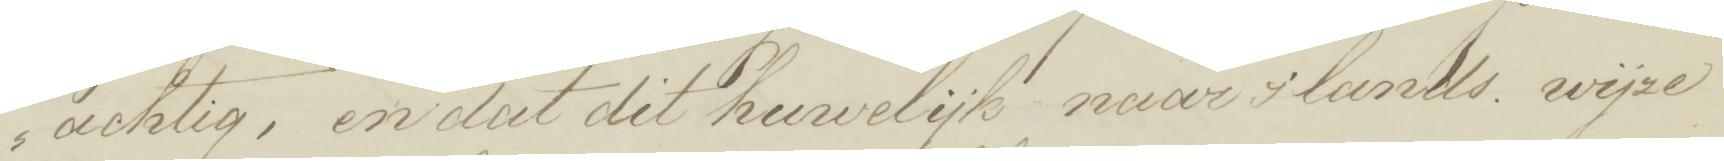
„achtig, en dat dit huwelijk naar s lands. wijze
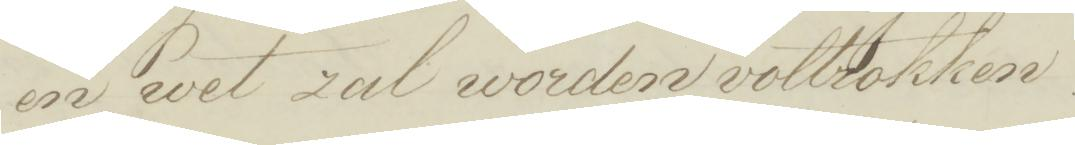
en wet zal worden voltrokken
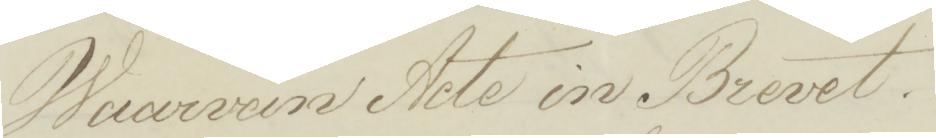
Waarvan Acte in Brevet.
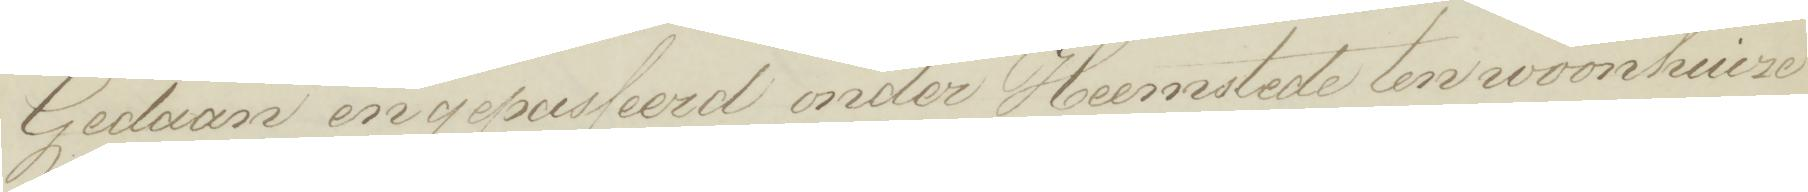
Gedaan en gepasseerd onder Heemstede ten woonhuize
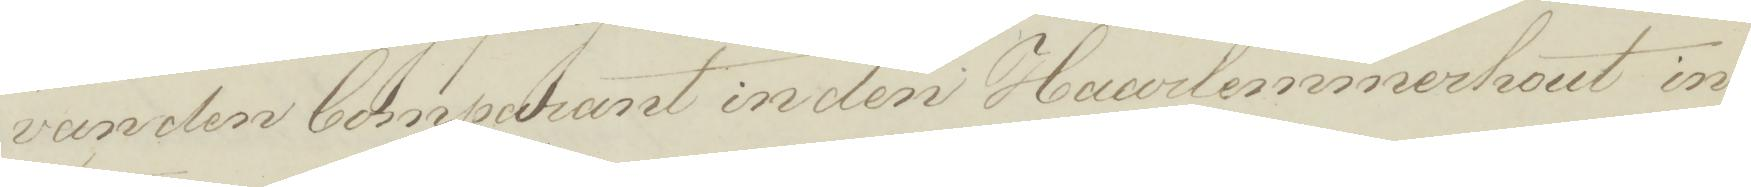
van den Comparant in den Haarlemmerhout in
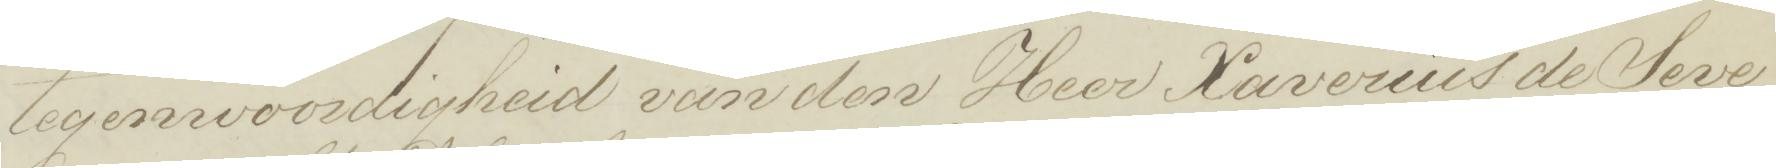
tegenwoordigheid van den Heer Xaverius de Seve
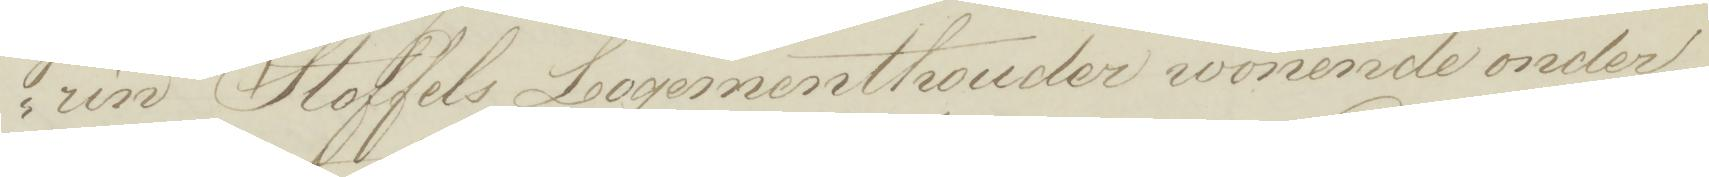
„rin Stoffels Loogementhouder wonende onder
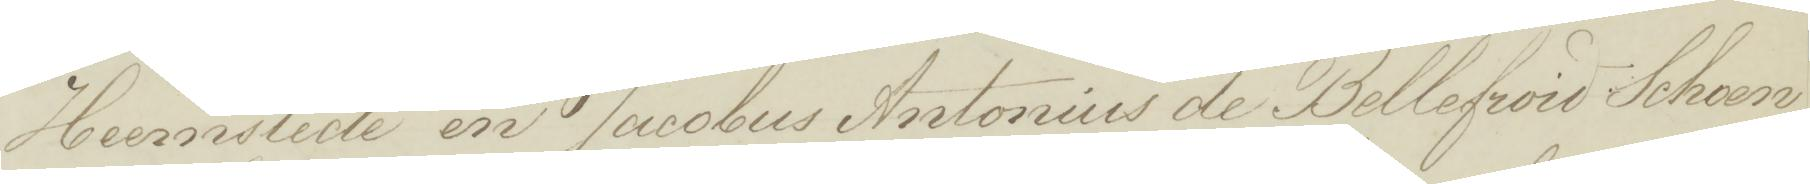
Heemstede en Jacobus Antonius de Bellefroid Schoen,
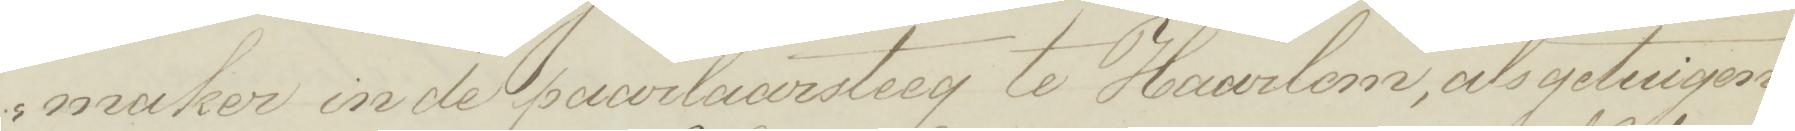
„maker in de paarlaarsteeg te Haarlem, als getuigen,
